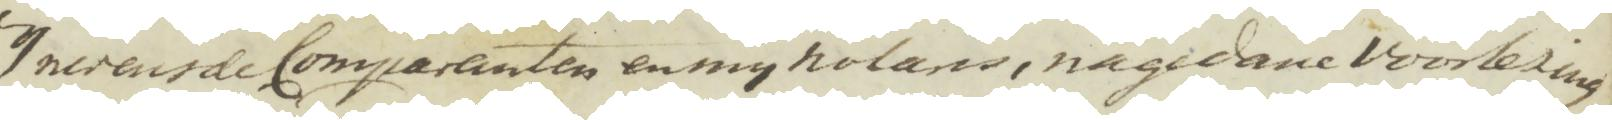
nevens de Comparanten en my notaris, na gedane Voorlezing
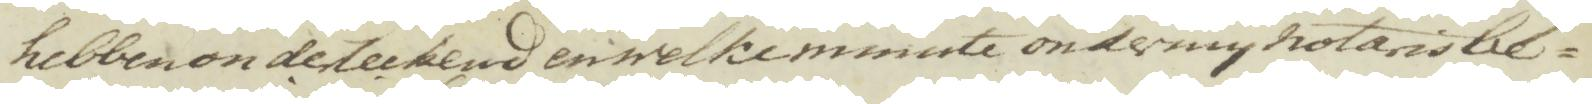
hebben onderteekend en welke minute onder mij notaris be=
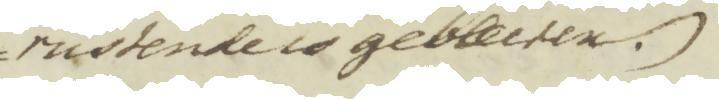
rustende is gebleeven.
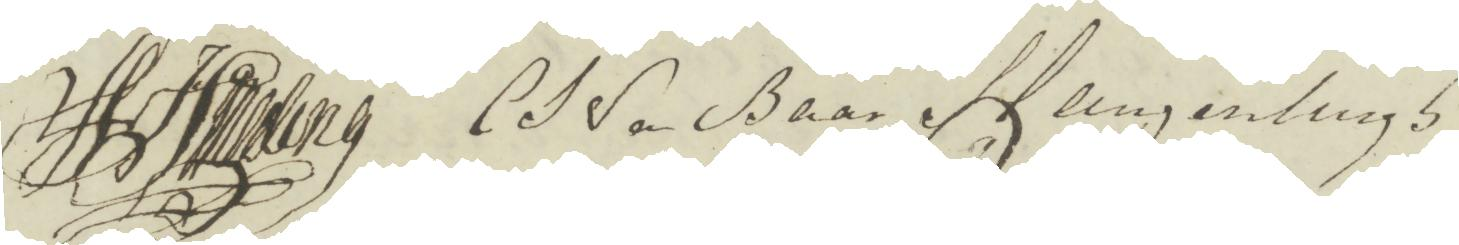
JSHueden CJ van Baar Slangenburgh
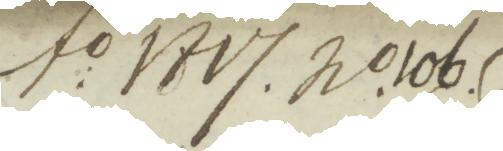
A:o 1817. N.o106.
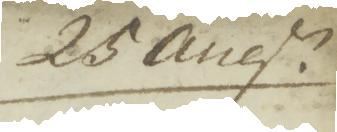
25 Aug.s
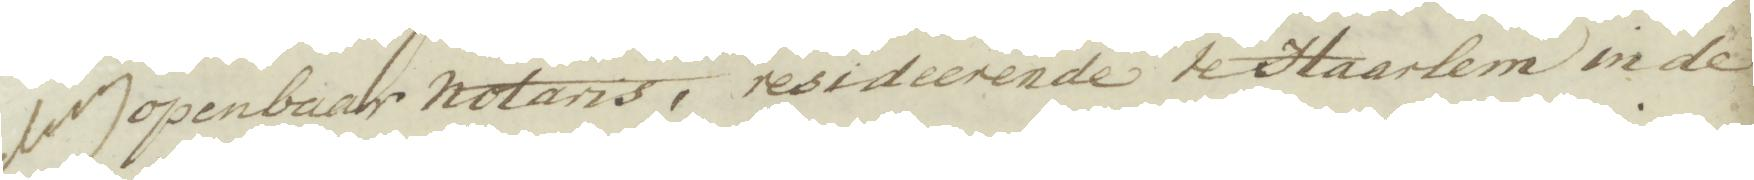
openbaar notaris, resideerende te Haarlem in de
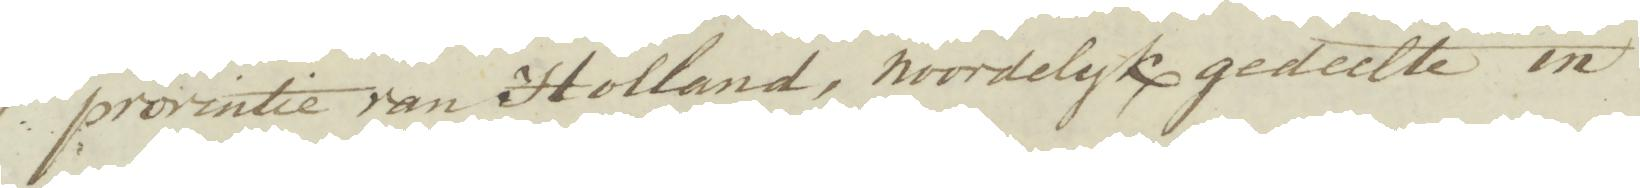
provintie van Holland, noordelijk gedeelte in
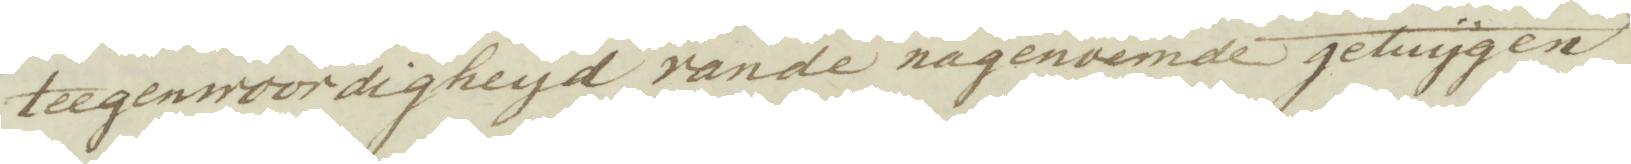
teegenwoordigheyd van de nagenoemde getuijgen
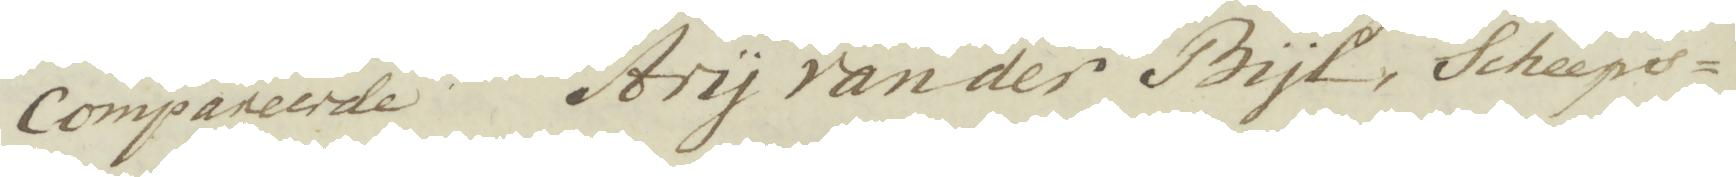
compareerde Arij van der Bijl, Scheeps=
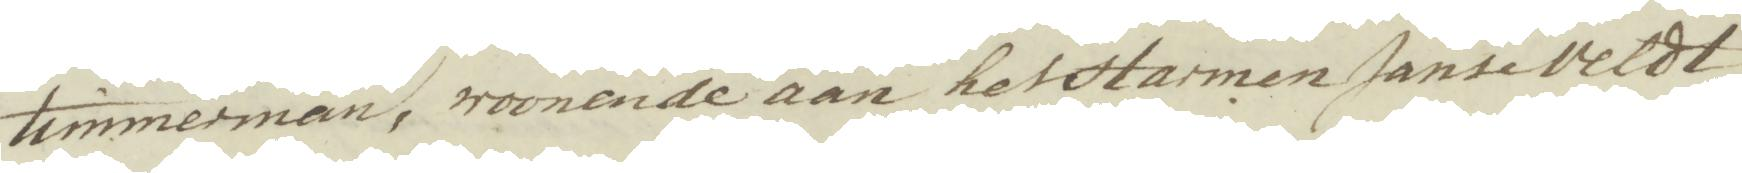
timmerman, woonende aan het Harmen Janse Veldt,
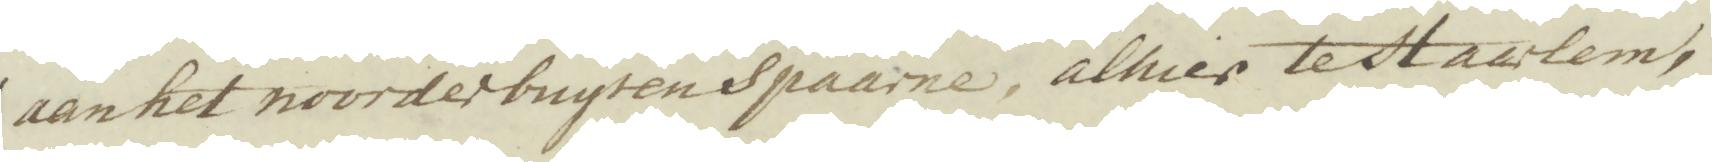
aan het noordebuyten spaarne, alhier te Haarlem,
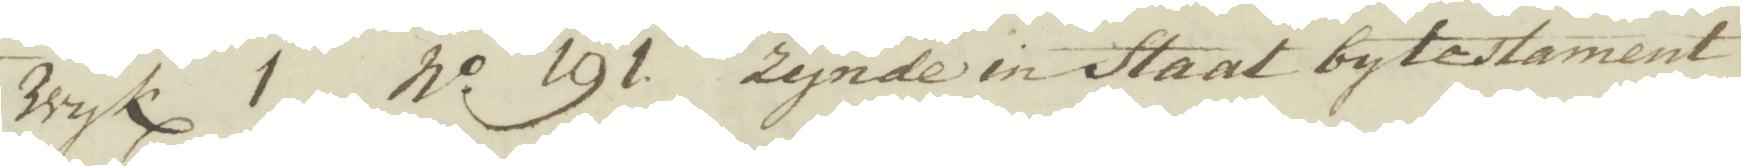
Wyk 1 n.o 191. zijnde in staat bij testament
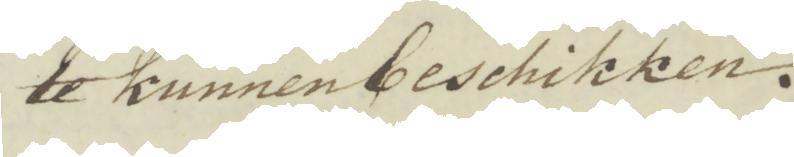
te kunnen beschikken.
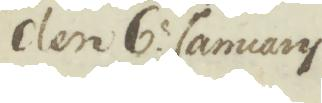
den 6.e Januarij
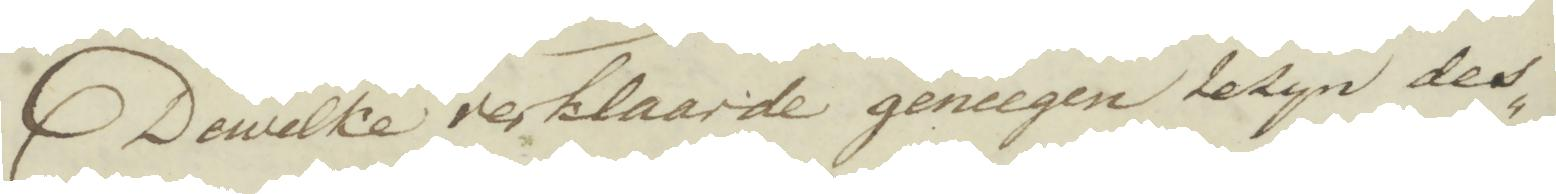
Dewelke verklaarde geneegen tezyn des„
